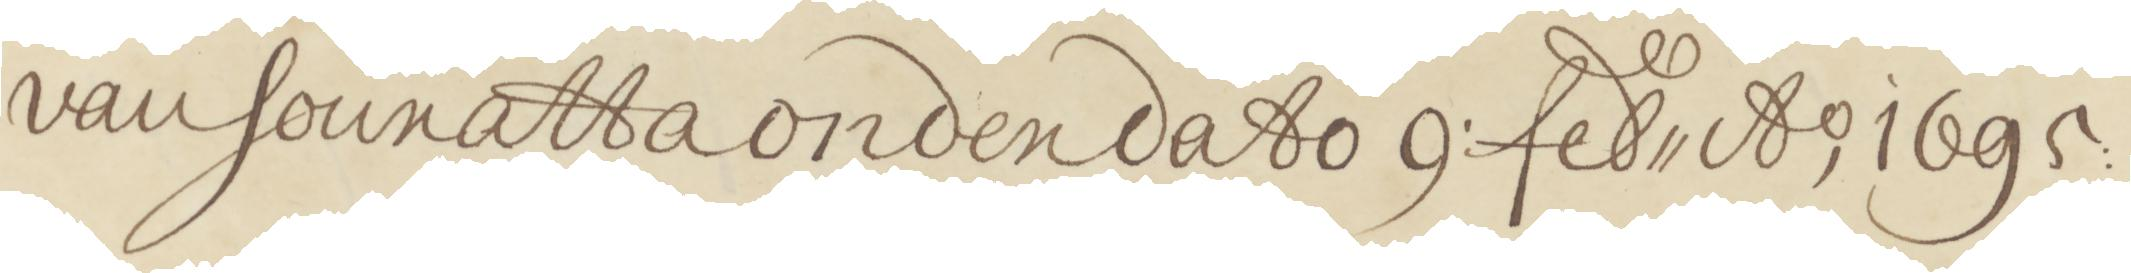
van souratta onder dato 9: feb„ A,o 1695:
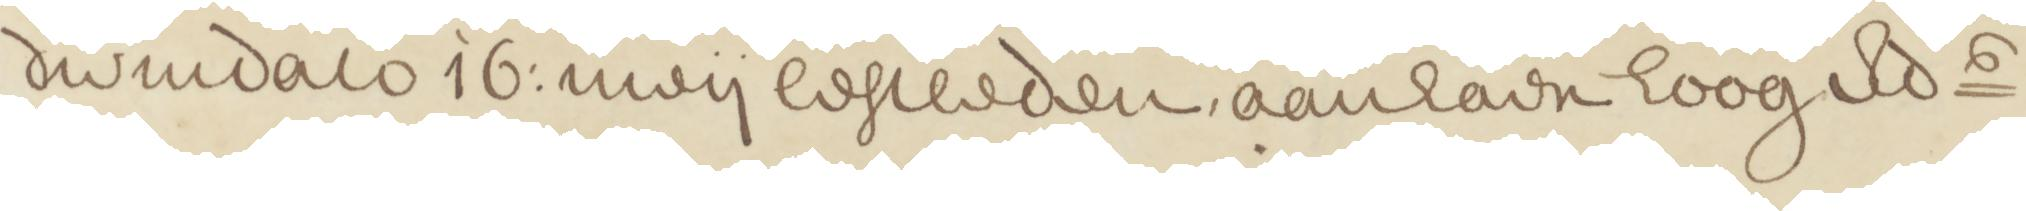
die indato 16: meij lestleden, aanhaer hoog Ed=s
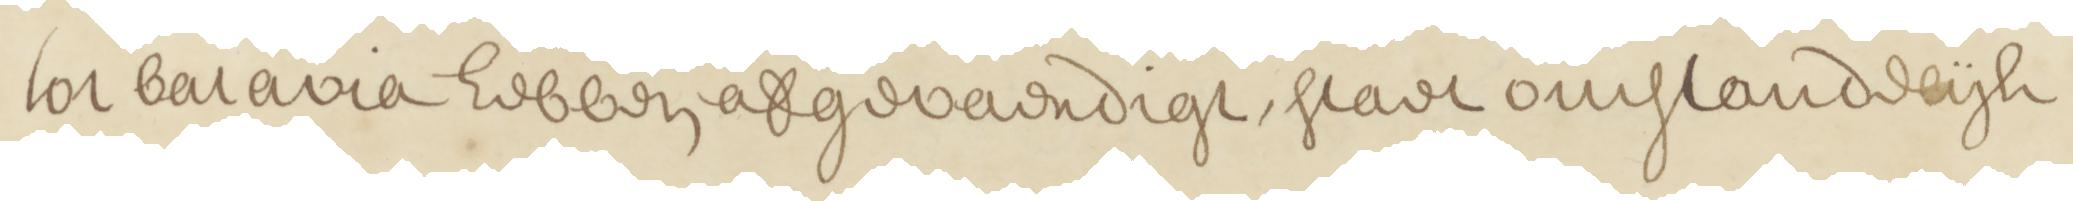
tot batavia hebben afgevaerdigt, staet omstandelijk
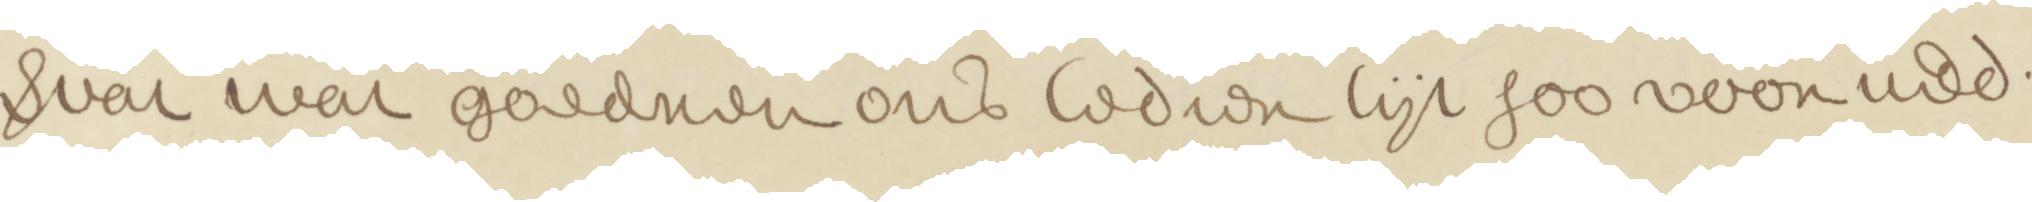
vervat wat goedren ons tedier tijt soo voor uEd:
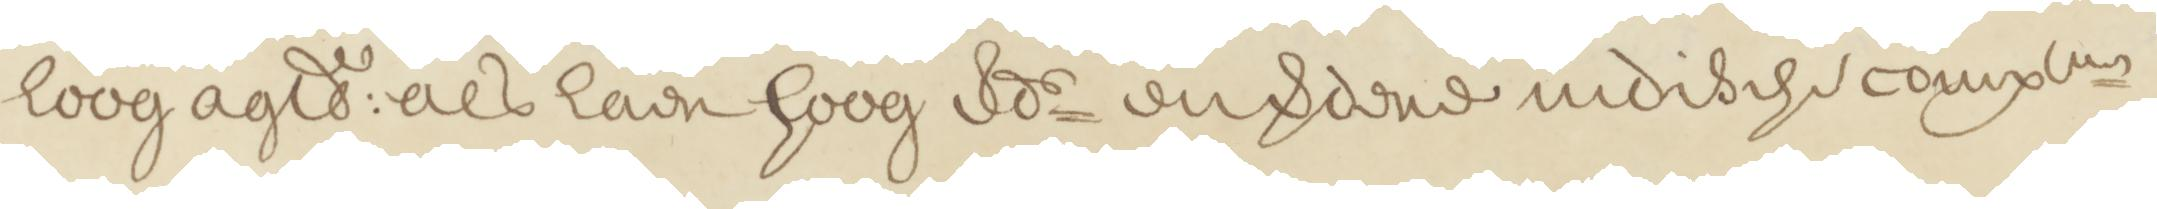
hoog agtb:e als haer hoog Ed=s enverdere indische comp=ten
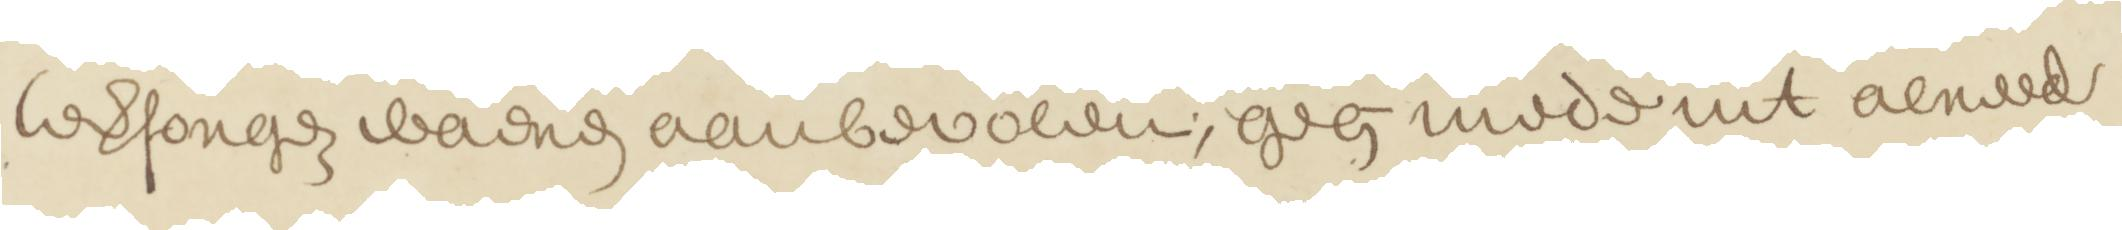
teversorgen waeren aanbevolen; gelijk mede in't alreede
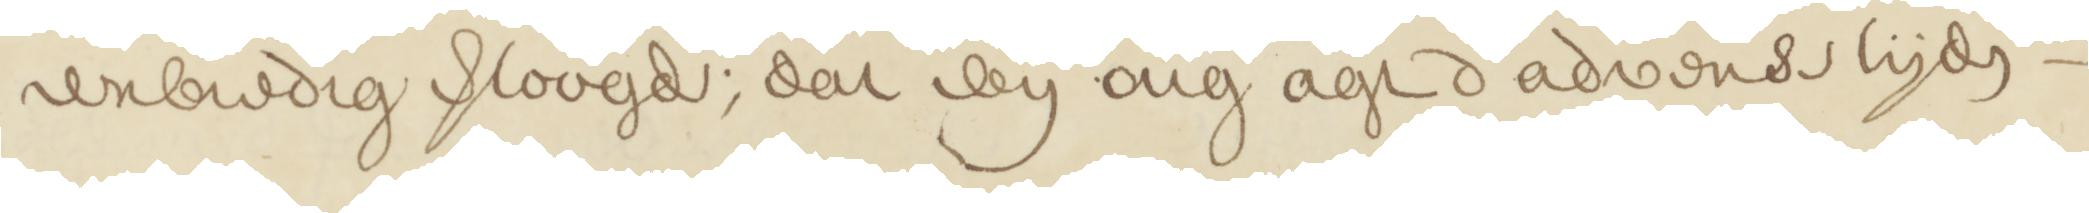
eerbiedig vertoogde; dat wij ong' agt d'advense tijden —
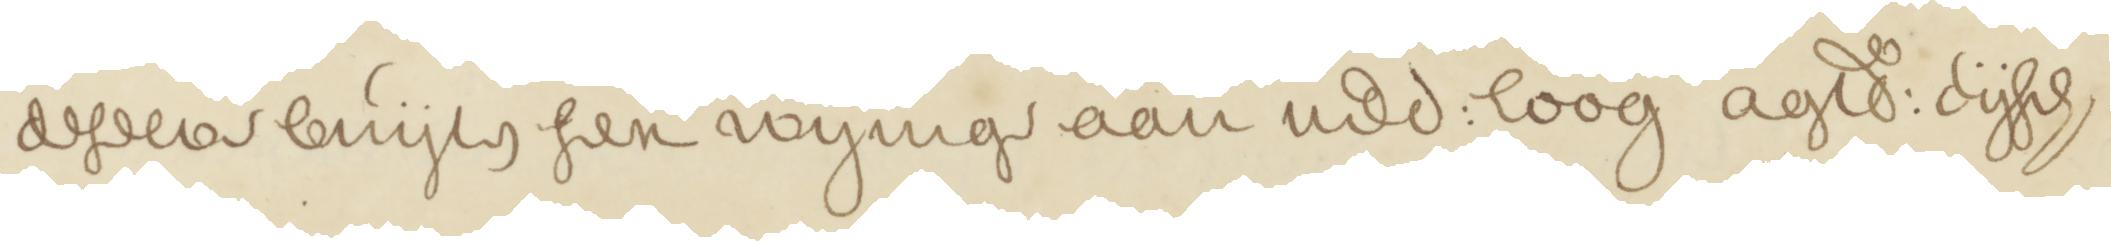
deselve buijten seer wijnige aan uEd: hoog agtb:e Eijsch
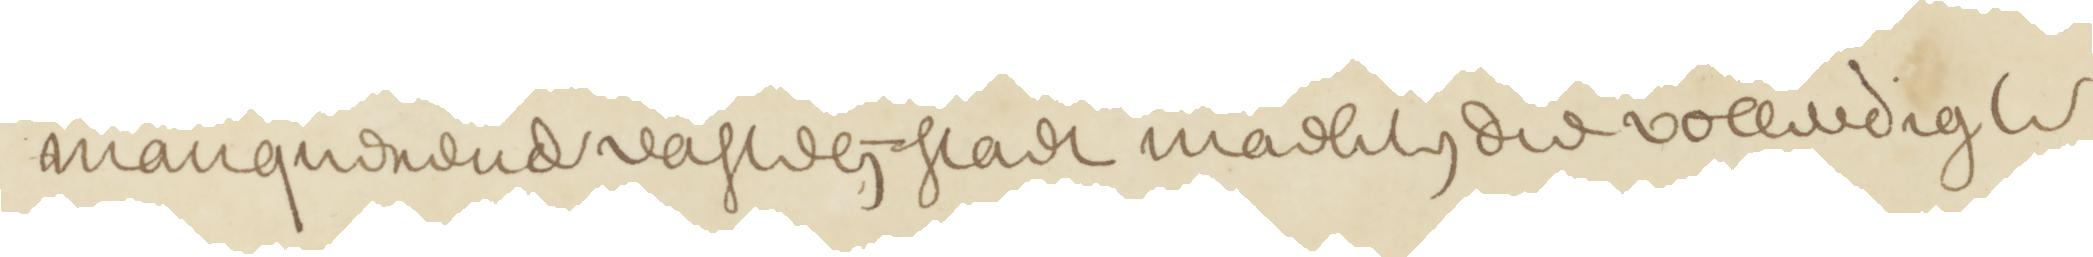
manquerende vastelijk staet maekten die volleedig te
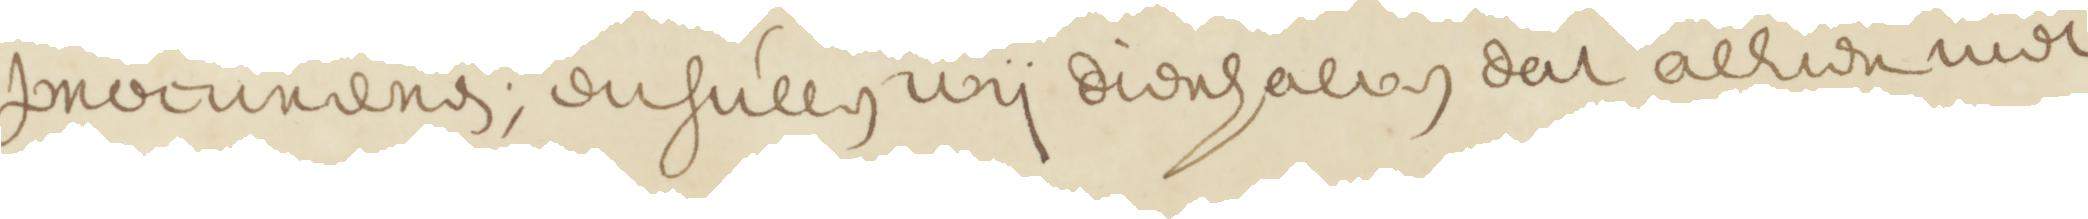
precureren; ensullen wij dierhalven dat alhier niet
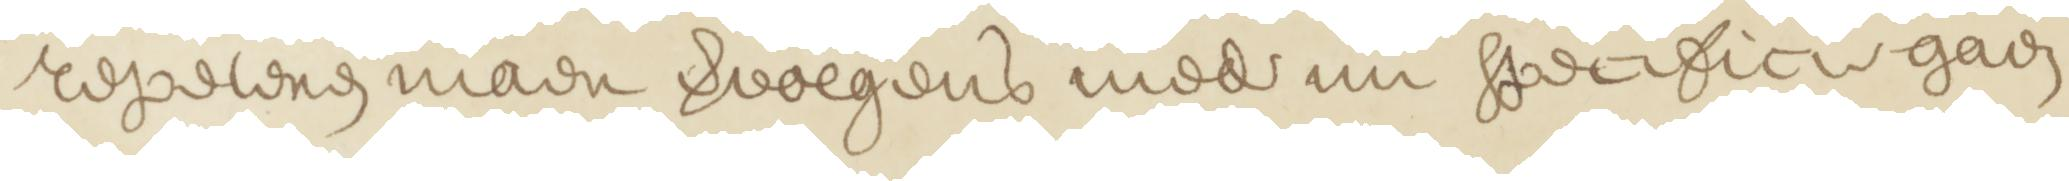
repeteren maer vervolgens mede nu specificie gaen
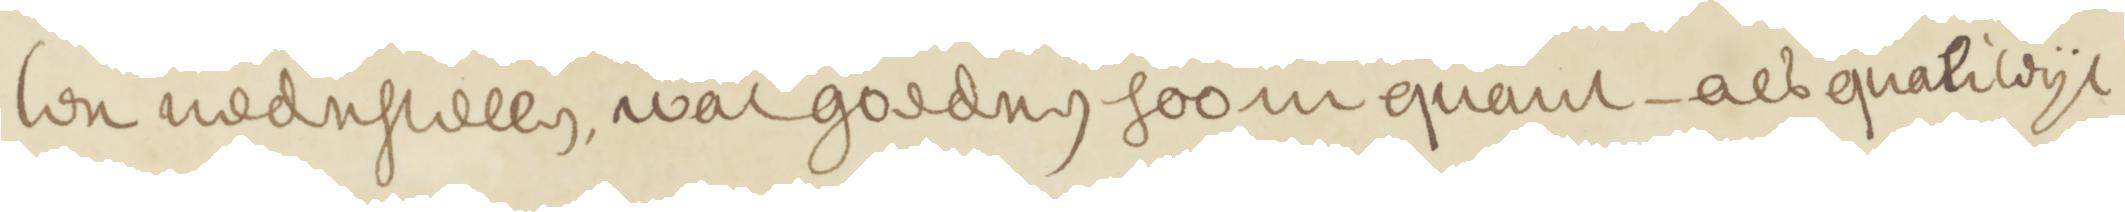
ter nederstellen, wat goederen soo in quant - als qualiteijt
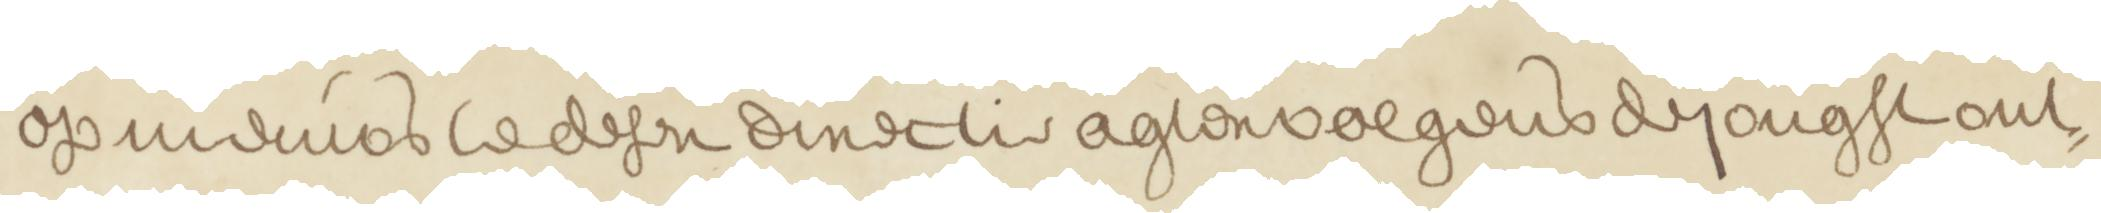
op nieuws tedeser directie agtervolgens dejongst ont„
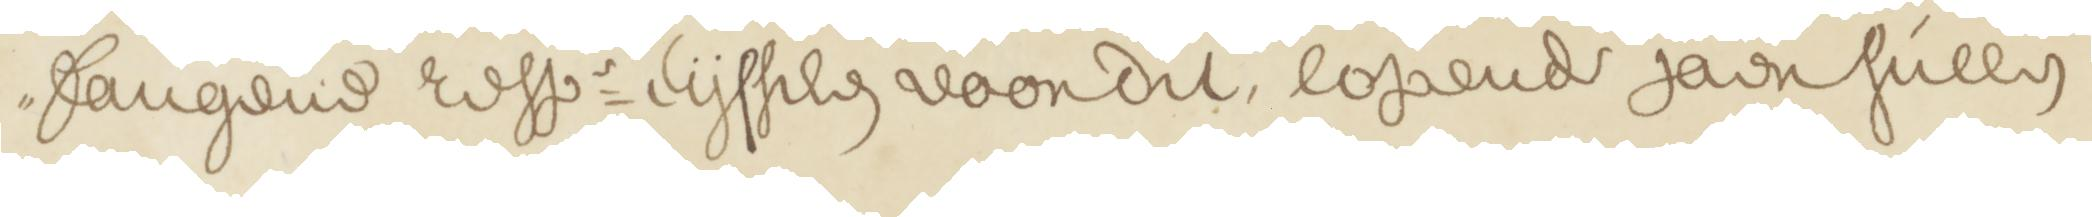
„fangene resp=e Eijsschen voordit, lopende jaer sullen
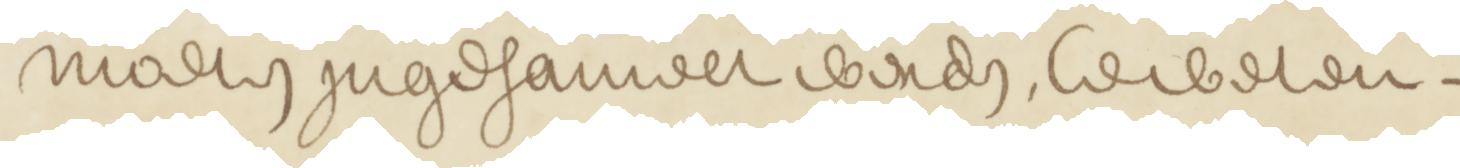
moeten jngesamelt werden, teweten —
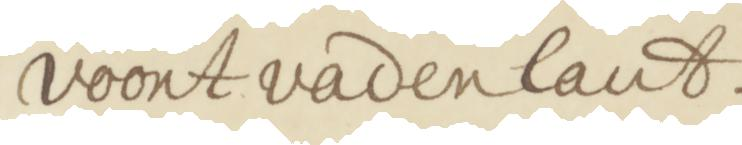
voor't vaderlant —
